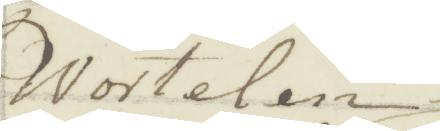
Wortelen
